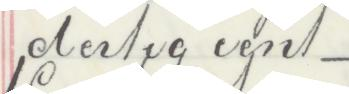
dertig cent
